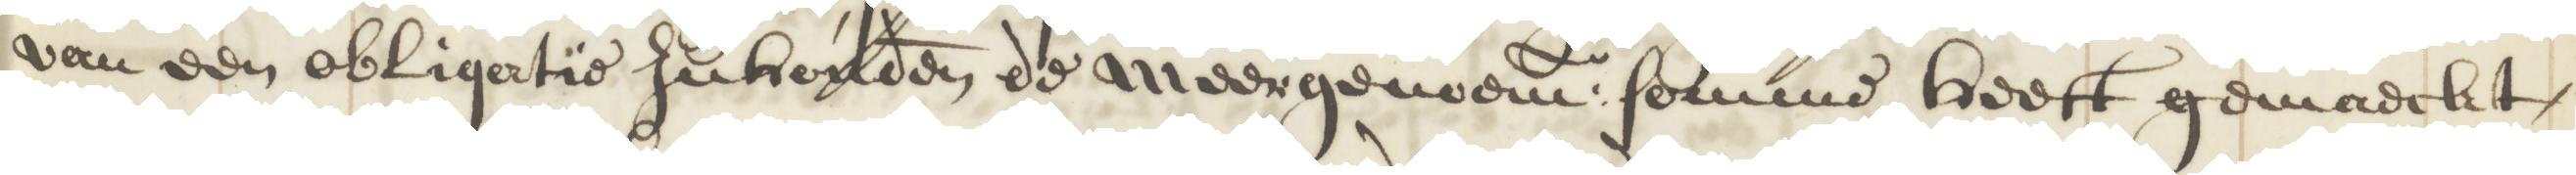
van een obligatie Jnhouden de Meer genoem:e somme heeft gemaeckt,
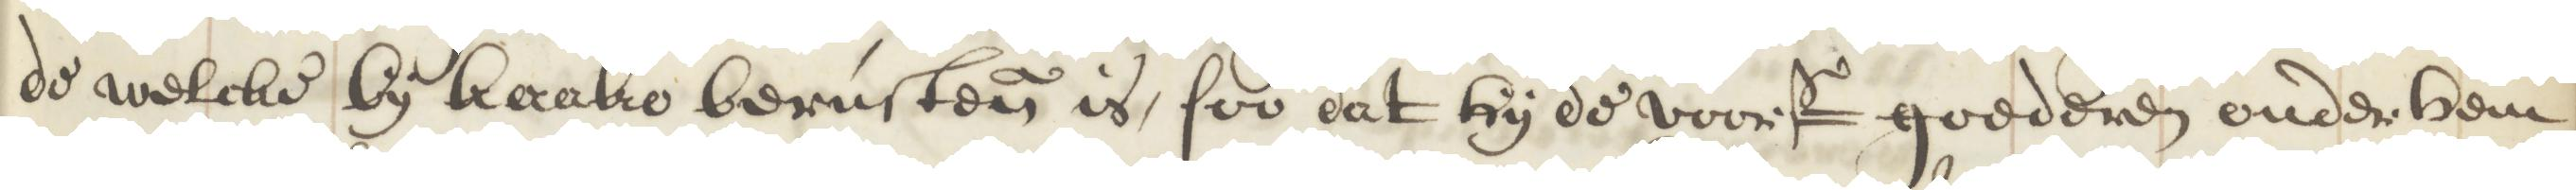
de welcke bij kaako berusten:e is, soo dat hij de voor=se goederen onder hem
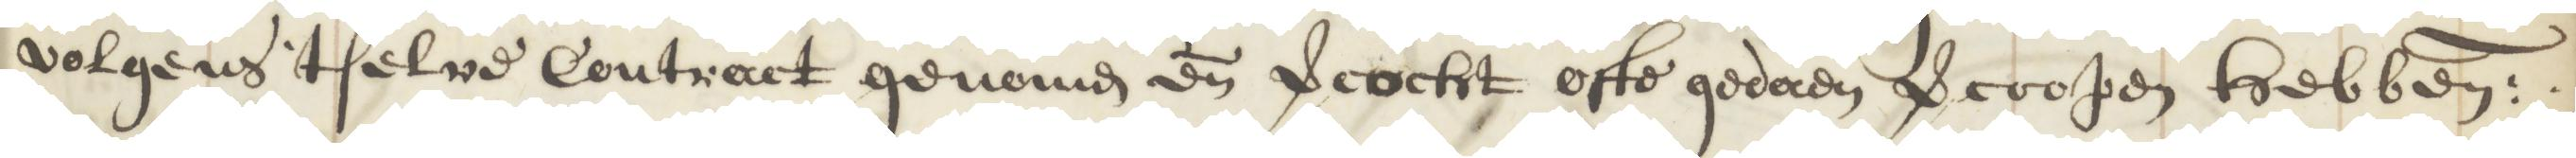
volgens 'tselve Contract genomen ende vercocht ofte gedaen vercoopen hebben:
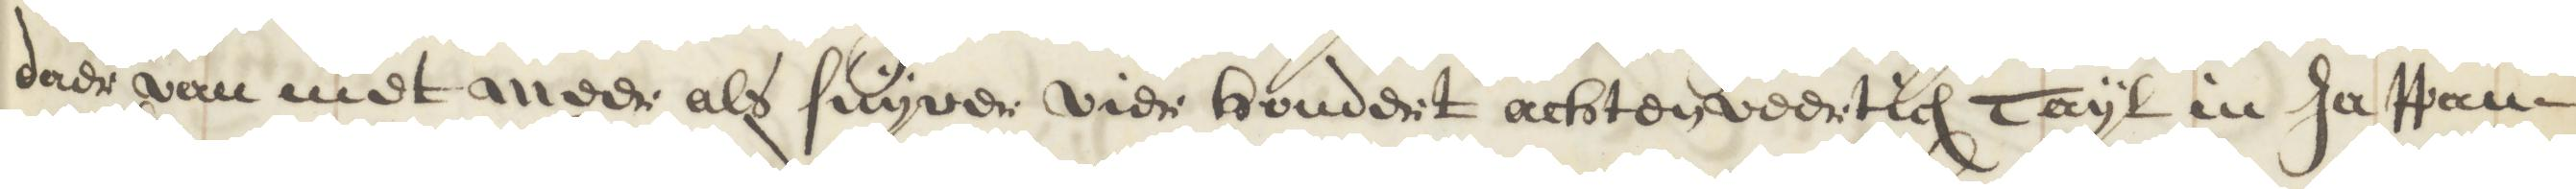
daer van niet meer als suijver vier hondert achten veertich Taijl in Jappan
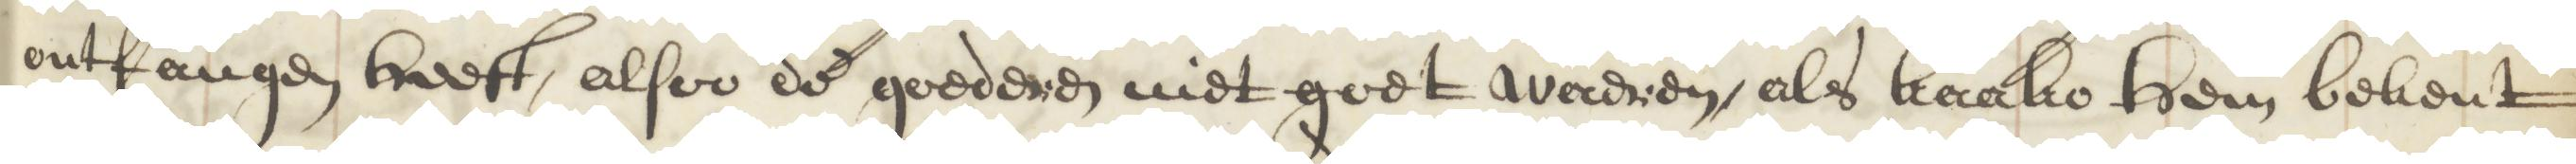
ontfangen heeft, alsoo de goederen niet goet waeren, als kaako hem bekent
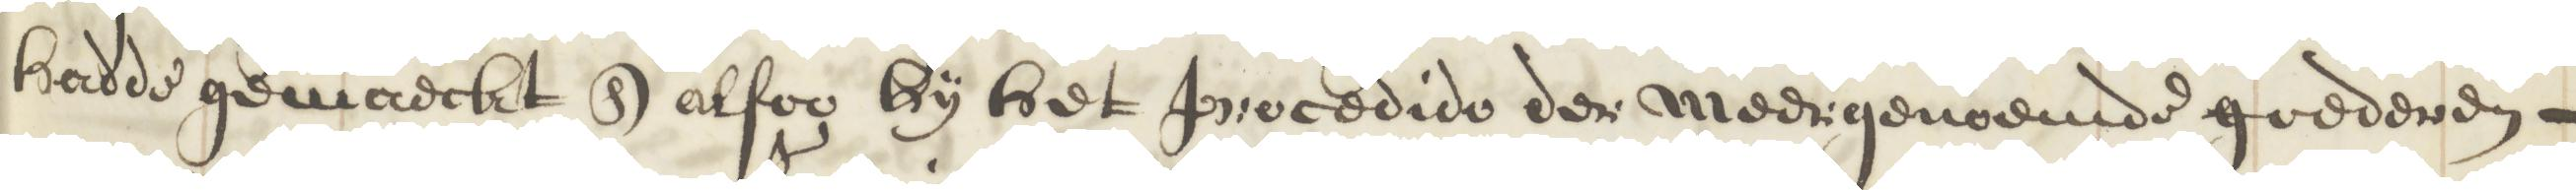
hadde gemaeckt ende alsoo hij het procedido der meergenoemde goederen
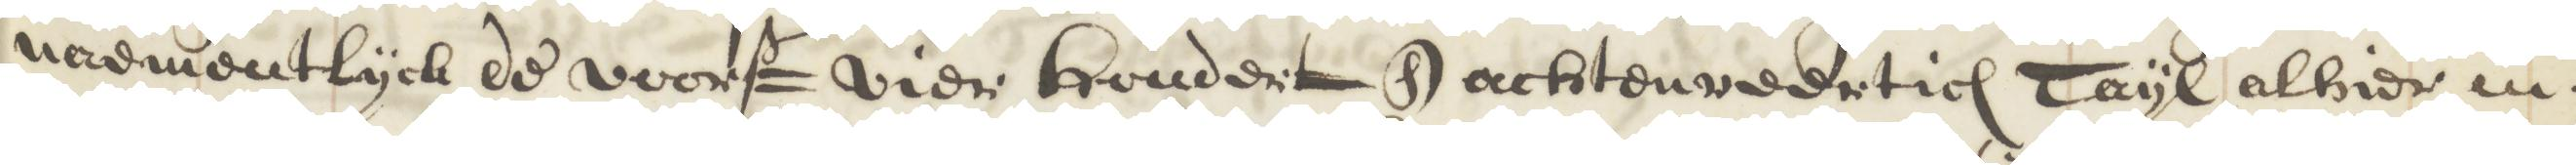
naementlijck de voors=e vier hondert achtenveertich Taijl alhier in
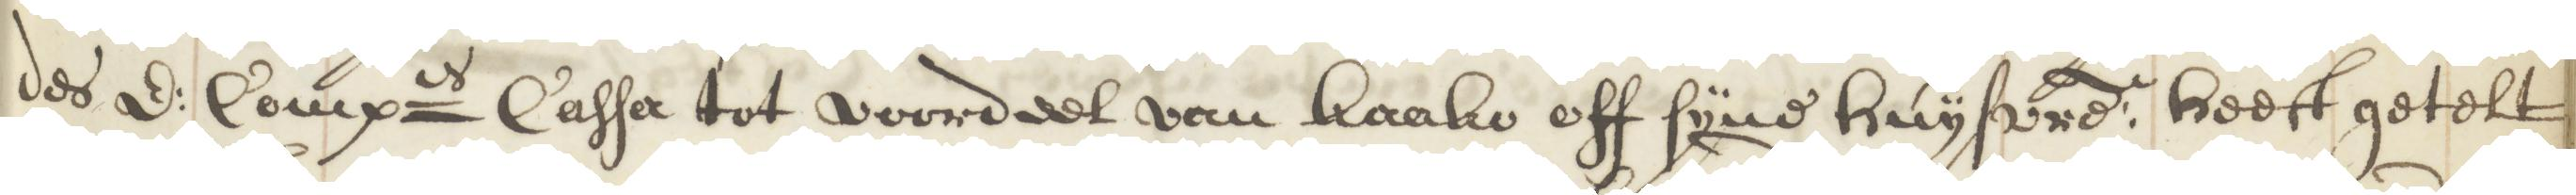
des E: Comp=es Cassa tot voordeel van kaako off sijne huijsvre:e heeft getelt
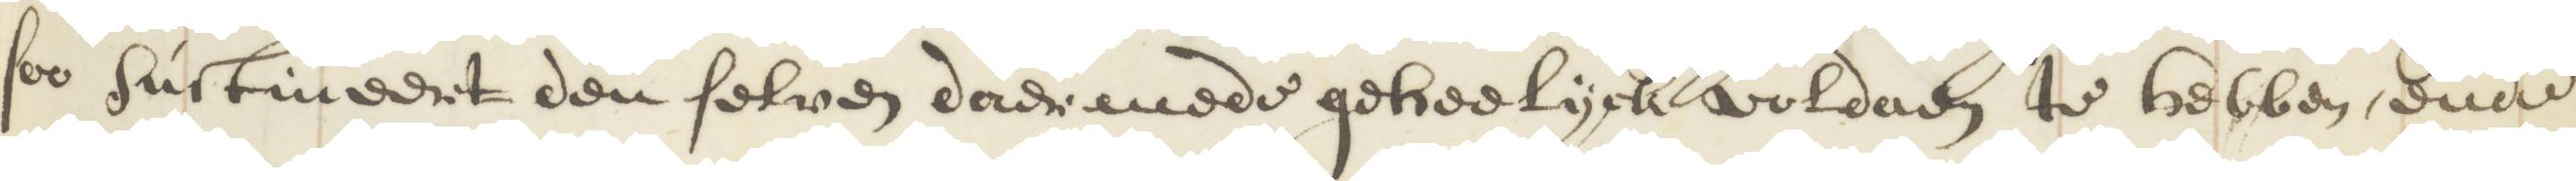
soo sustineert den selven daer ende geheelijck voldaen te hebben, ende
